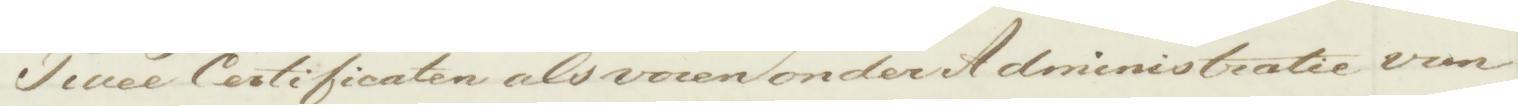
Twee Certificaten als voren onder Administratie van
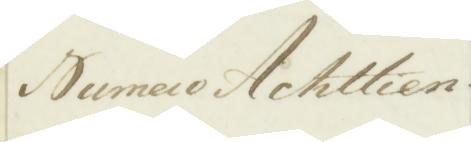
Numero Achttien.
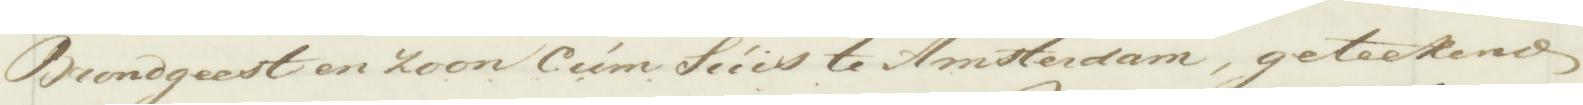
Brondgeest en zoon Cum Suis te Amsterdam, geteekend
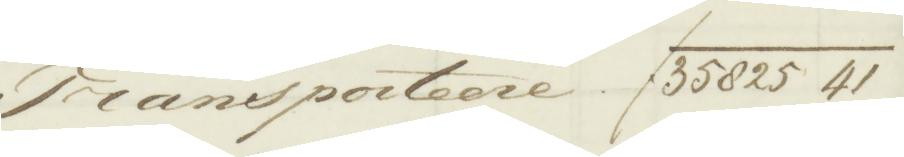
Transporteere . ƒ35825 41
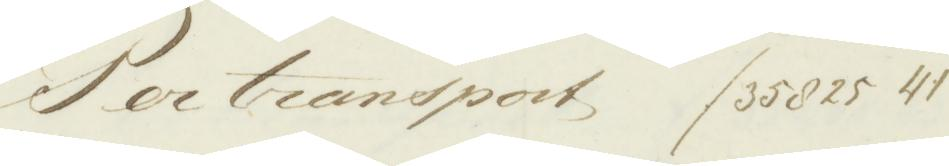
Per transport ƒ35825 41
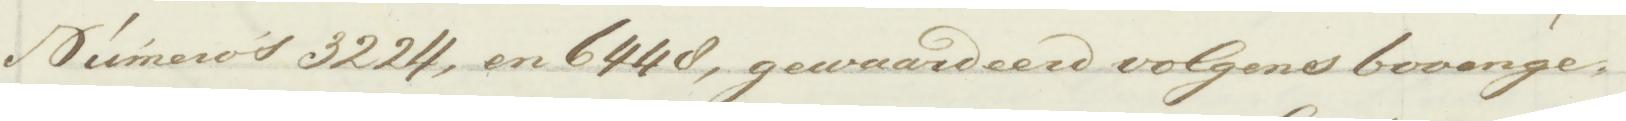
Numero's 3224, en 6448, gewaardeerd volgens bovenge„
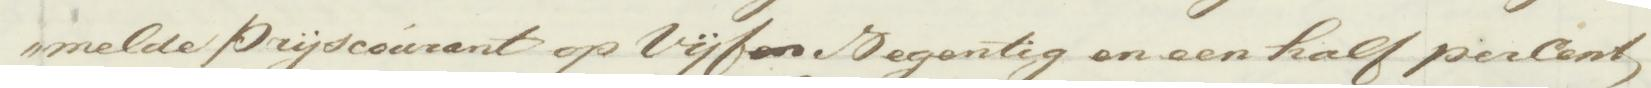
„melde Prijscourent op Vijf en Negentig en een half percent
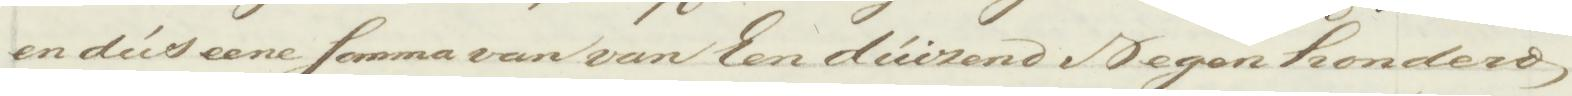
en dus eene somma van van Een duizend Negen honderd
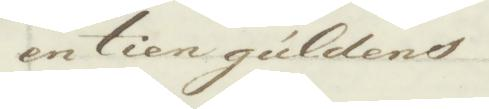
en tien guldens
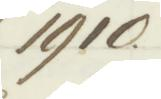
1910.
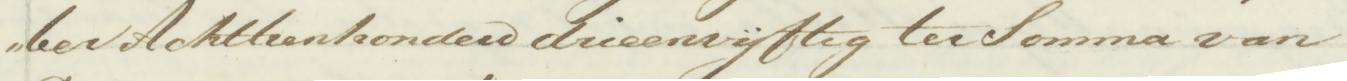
„ber Achttienhonderd drieenvijftig ter Somma van
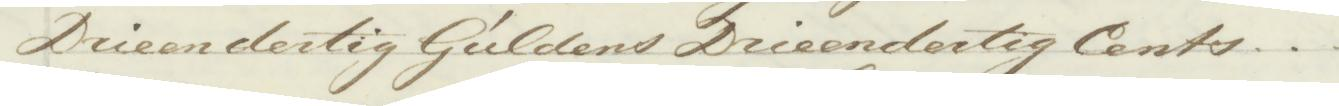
Drie en dertig Guldens Drieendertig Cents. . .
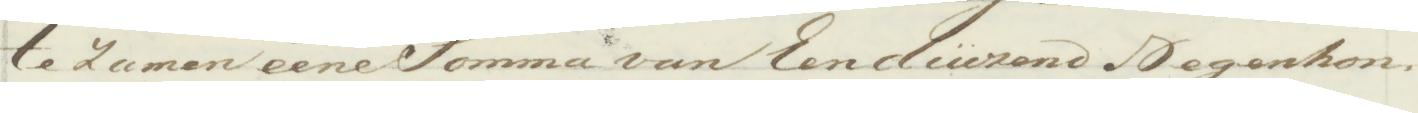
te zamen eene Somma van Een duizend Negenhon.
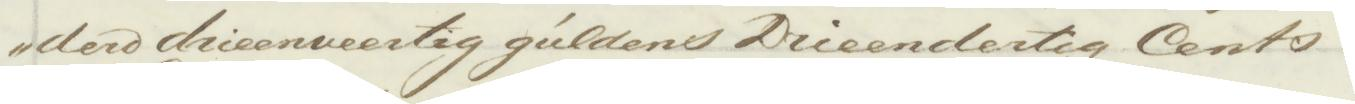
„derd drieenveertig guldens Drieendertig Cents.
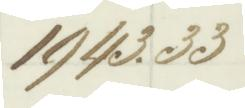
1943.33
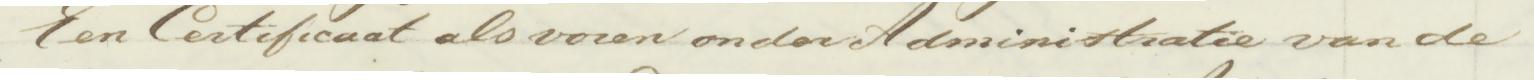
Een Certificaat als voren onder Administratie van de
